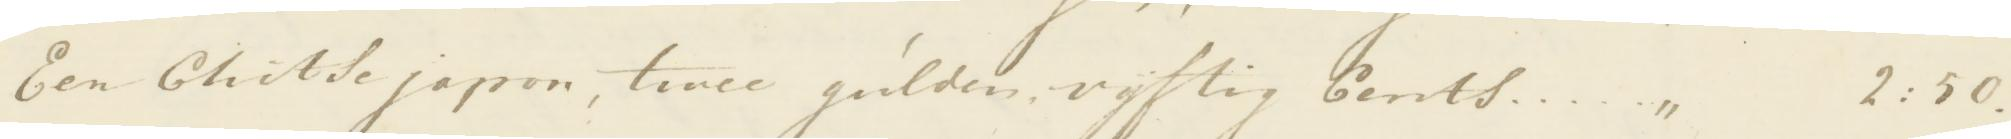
Een Chitse japon, twee gulden vijftig Cents . . . . . .„ 2:50.
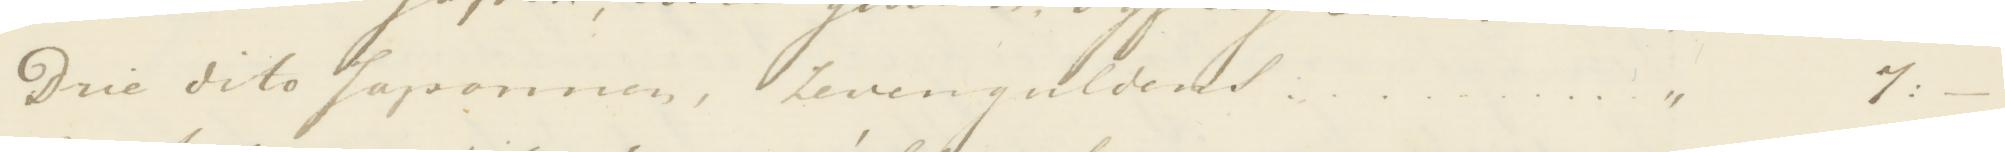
drie dito Japonnen, zeven guldens. . . . . . . . . . . . .„ 7:—
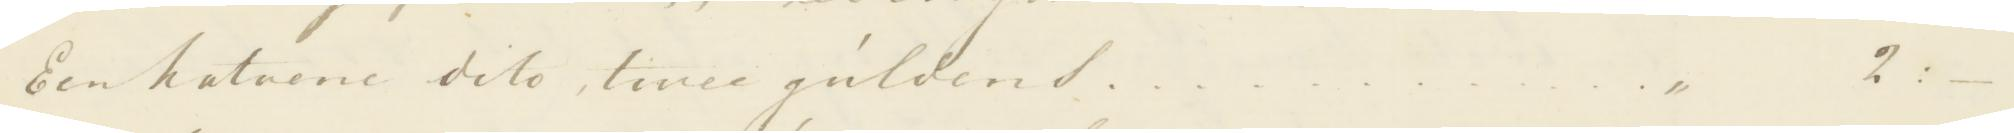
Een katoene dito, twee guldens „ . . . . . . . . . . . . . . 2:—
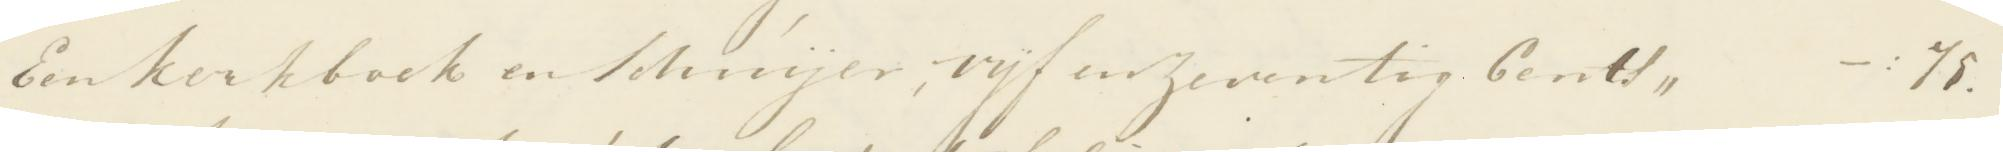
Een kerkboek en schuijer, vijf en zeventig Cents „ —:75.
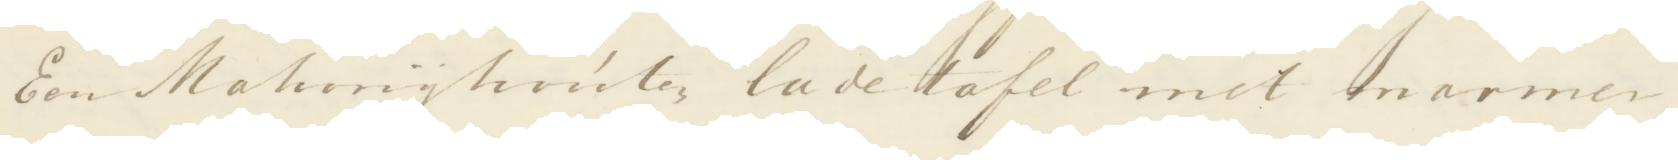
Een Mahonijhouten ladetafel met marmer
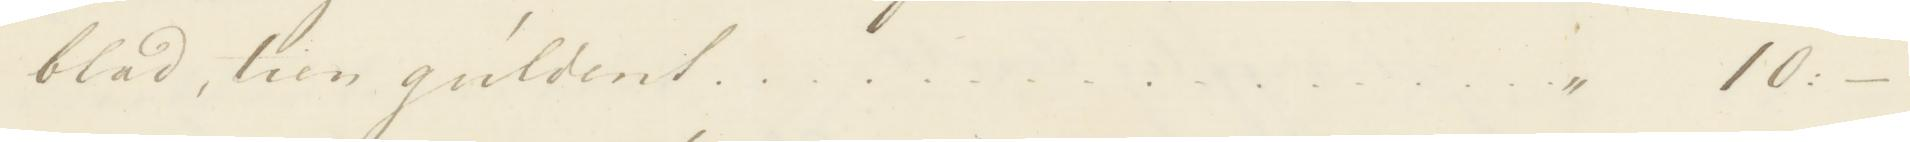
blad, tien guldens . . . . . . . . . . . . . . . . . .. . . . . . „ 10:—
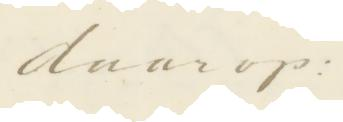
daarop:
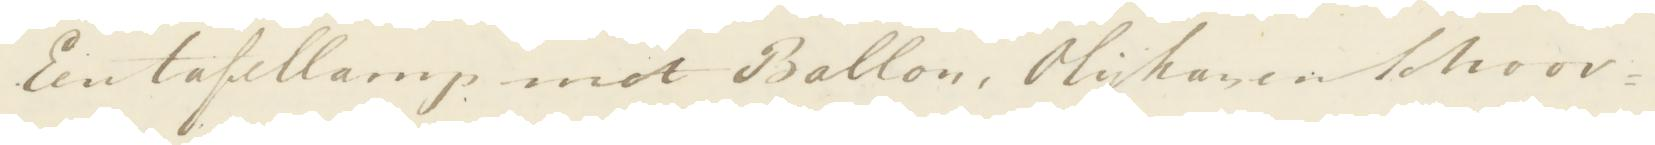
Een tafellamp met Ballon, Olijkan en schoor=
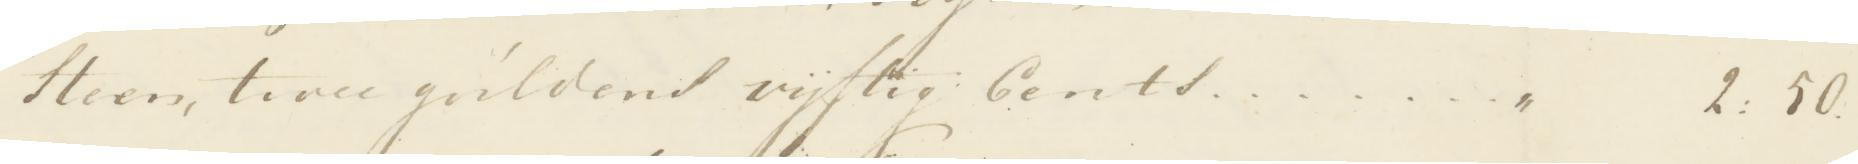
steen, twee guldens vijftig Cents. . . . . . . . . . . . . „ 2:50
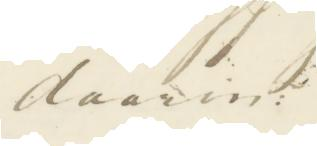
daarin:
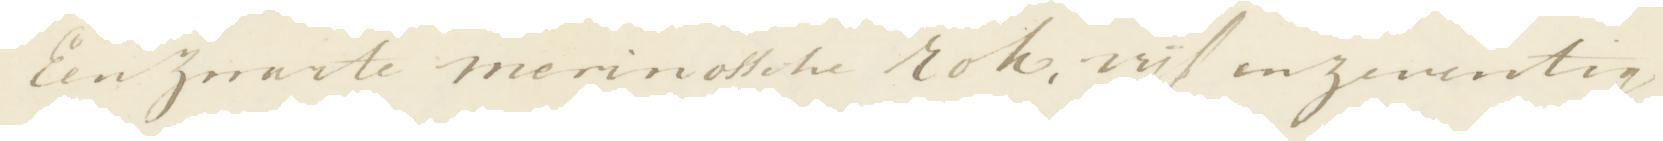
Een zwarte merinossche rok, vijf en zeventig
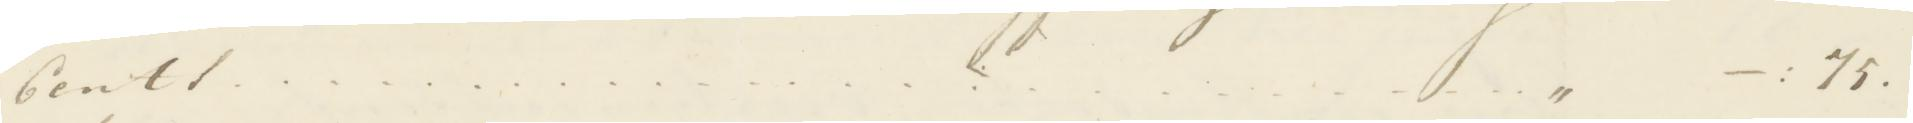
Cents . . . . . . . . . . . . . . . . . . . . . . . .. . . . . . . . . . . . . „ -:75.
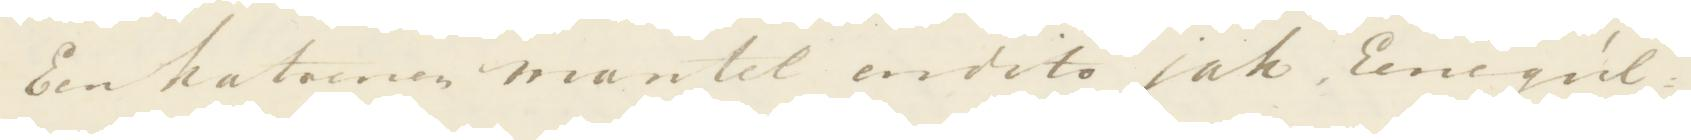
Een katoenen mantel en dito jak, Eene gul=
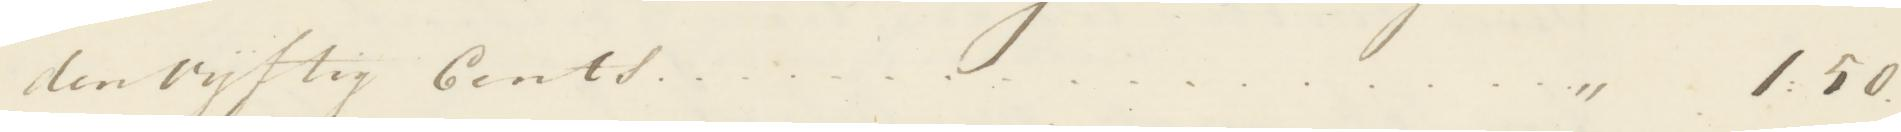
den vijftig Cents . . . . . . . . . . . . . . . . . . . . . . . . . . . „ 1:50.
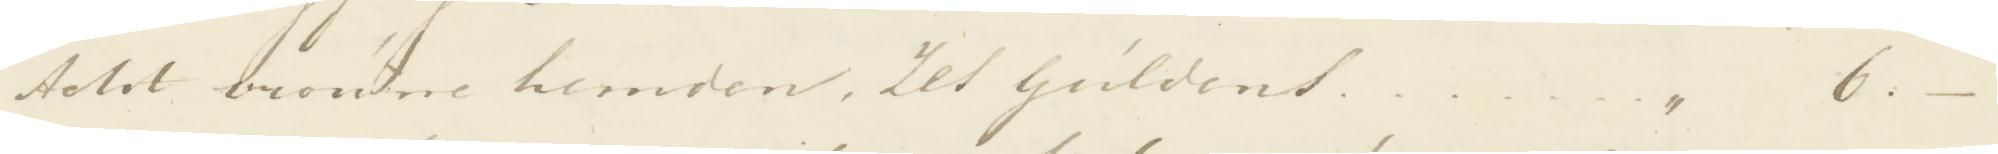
Acht vrouwe hemden, Zes guldens . . . . . . . . . . . .„ 6:—
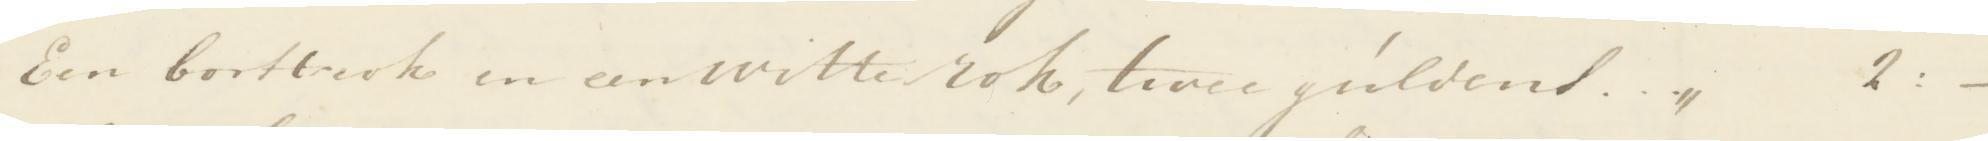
Een borstrok en een witte rok, twee guldens. . . . . „ 2:—
